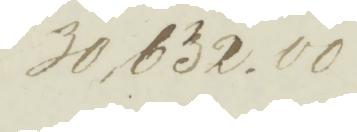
ƒ 30,632.00
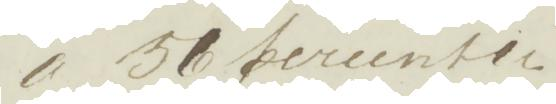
á 36 percenten
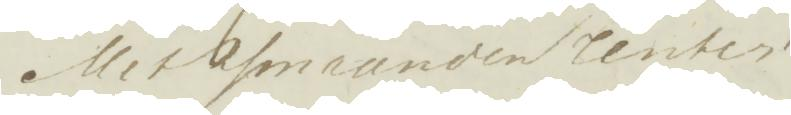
Met smaanden renten
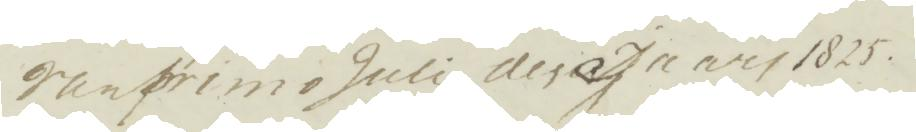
van primo Julij des jaars 1825.uary 1825.
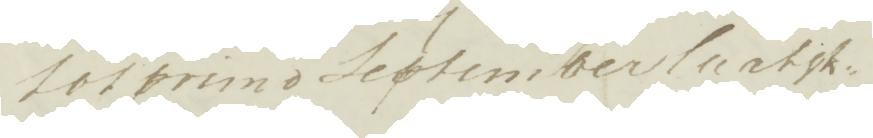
tot primo september laatijk„
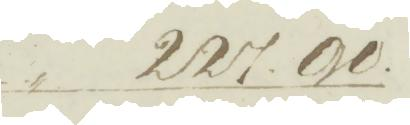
„ 227.00:
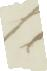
leden
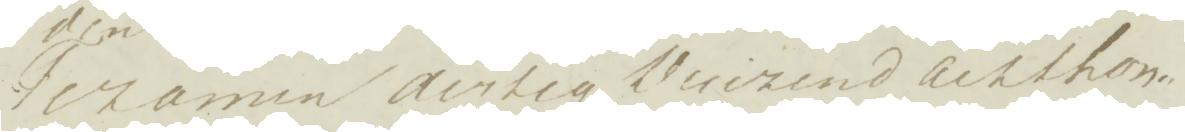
Tezamen dertig Duizend achthon„
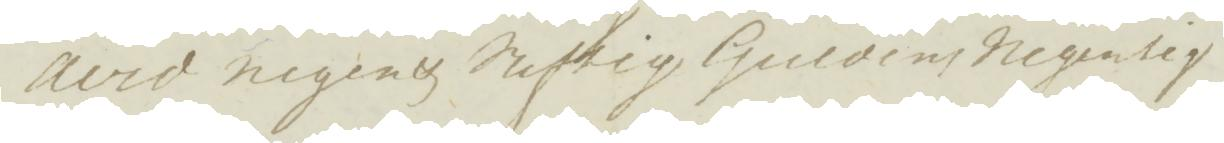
derd negen en vyftig Guldens negentig
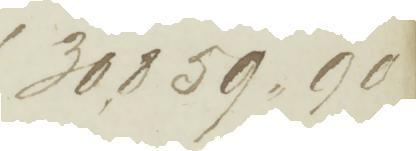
ƒ 30,859„90
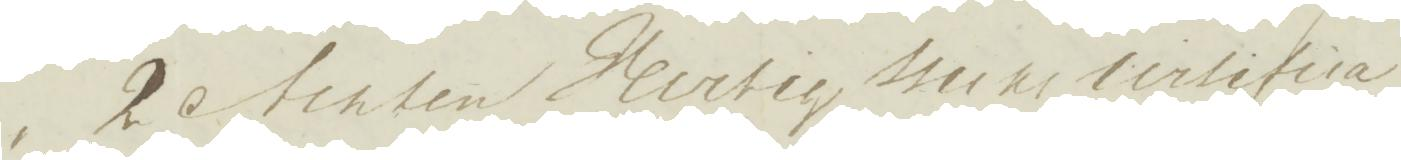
„ 2 Achten Veertig stuks certifica
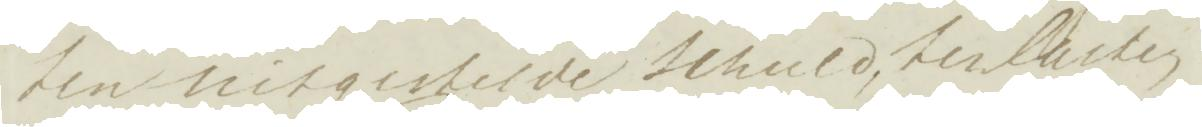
ten uitgestelde schuld, ter lasten
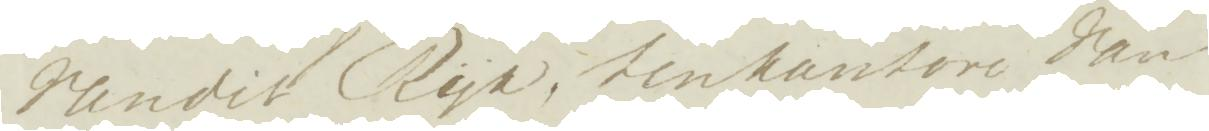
van dit Rijk, ten kantore van
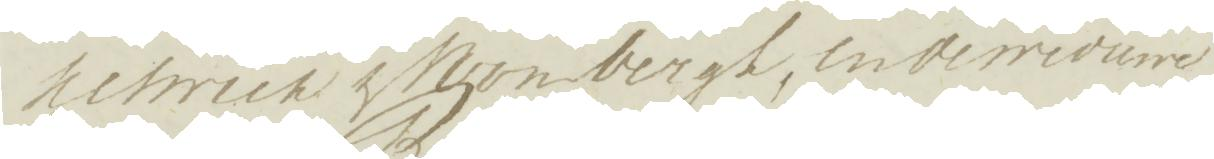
Ketwick en Vonbergh, en de weduwe
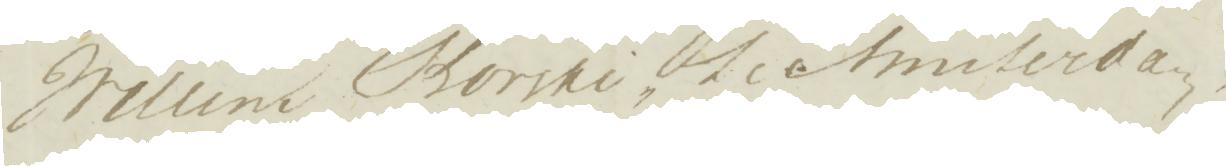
Willem Borski „ te Amsterdam,
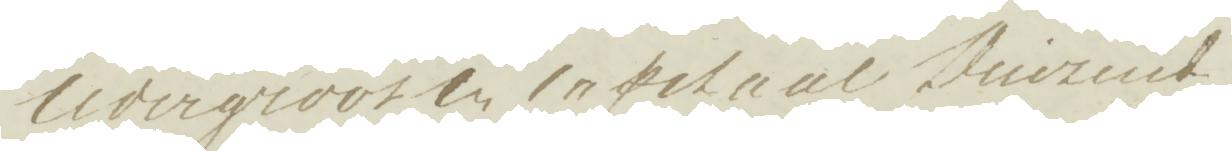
ieder groot in capitaal Duizend
